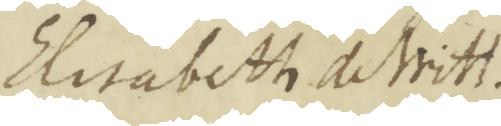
Elisabeth de Witt
